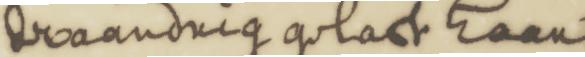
de vaandrig gelast haar
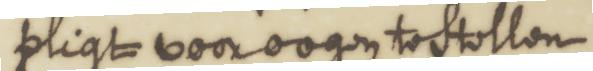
pligt voor oogen te stellen
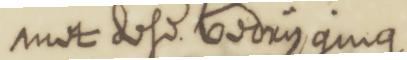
met dese bedrijging
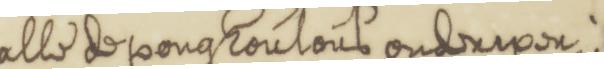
alle de ponghoulous onderwer
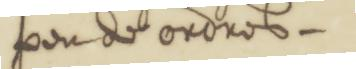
pen de ordres-
